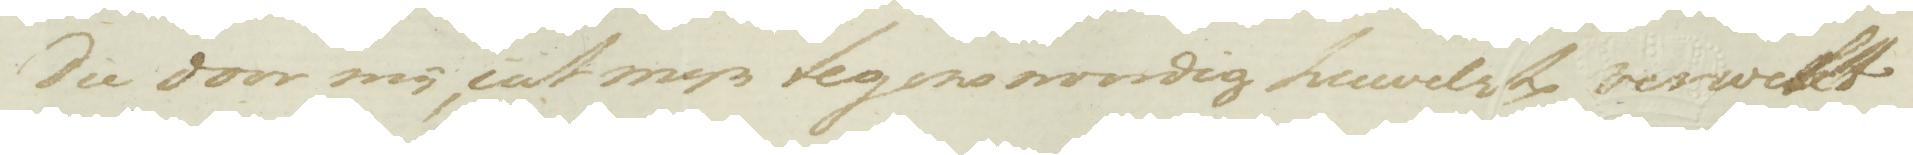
die door mij, uit myn tegenswoordig huwelyk verwekt
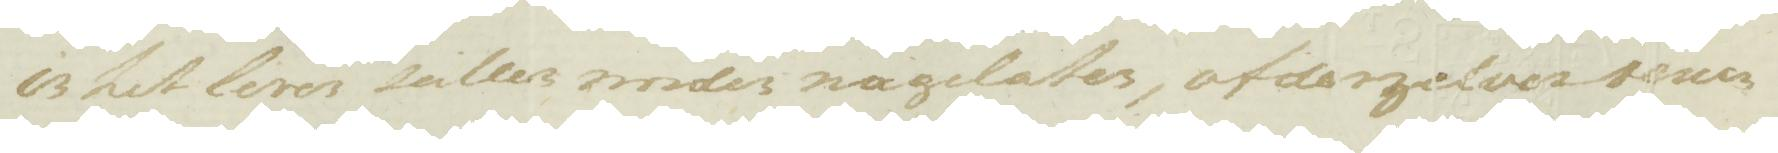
in het leven zullen worden nagelaten, of derzelver descen
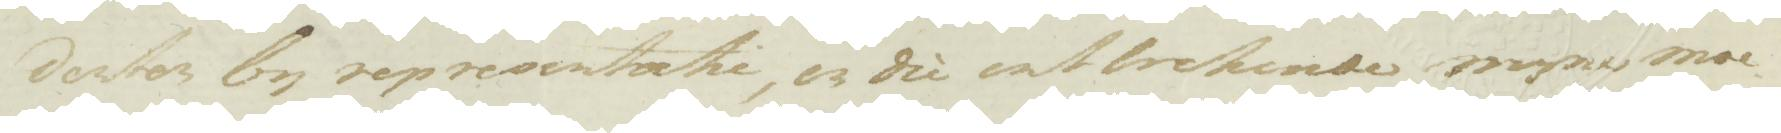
denten by representatie, en die ontbrekende myne moe
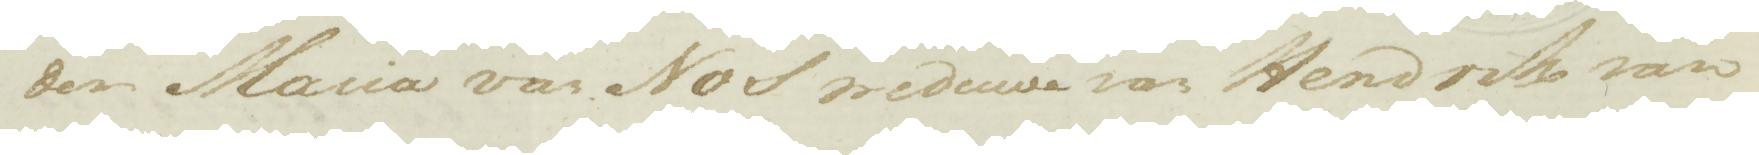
der Maria van Nos weduwe van Hendrik van
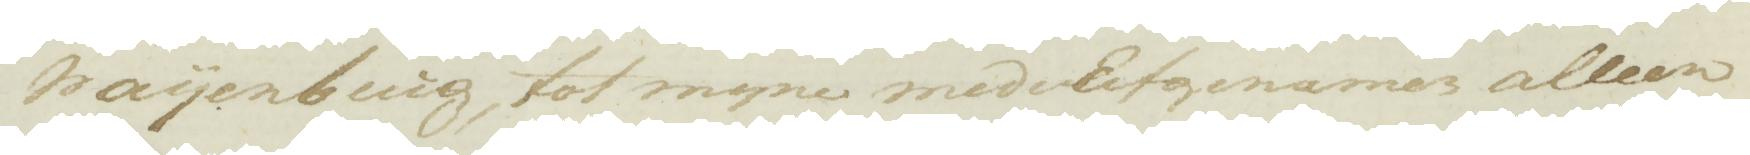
Waijenburg, tot myne mede Erfgenamen alleen
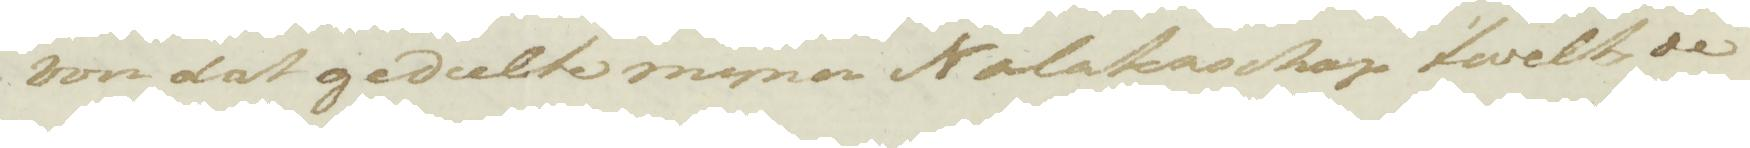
voor dat gedeelte myner Nalakaschap 'twelk de
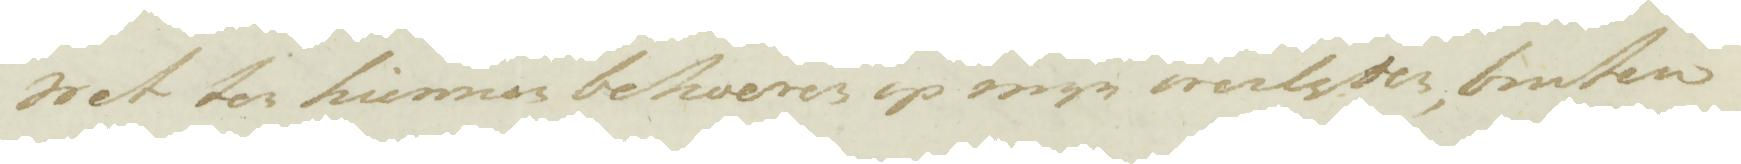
wet ten hunnen behoeven op myn overleven, buiten
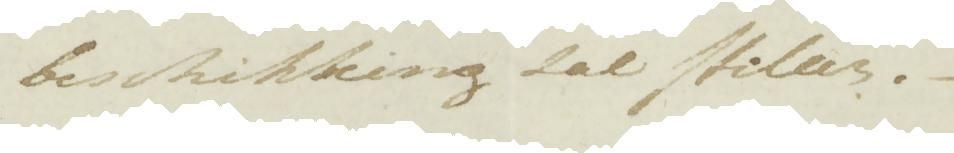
beschikking zal stellen.
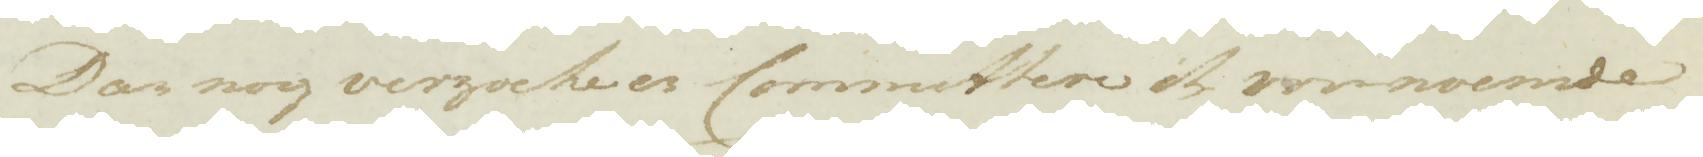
Dan nog verzoeke en Committere ik voornoemde
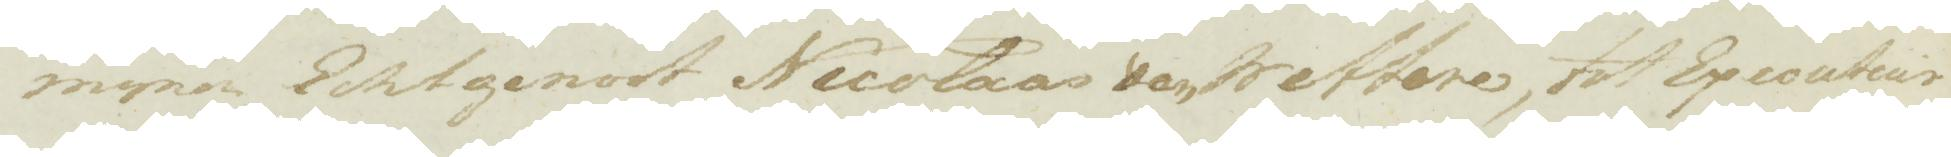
myner Echtgenoot Nicolaas van Wettere, tot Executeur
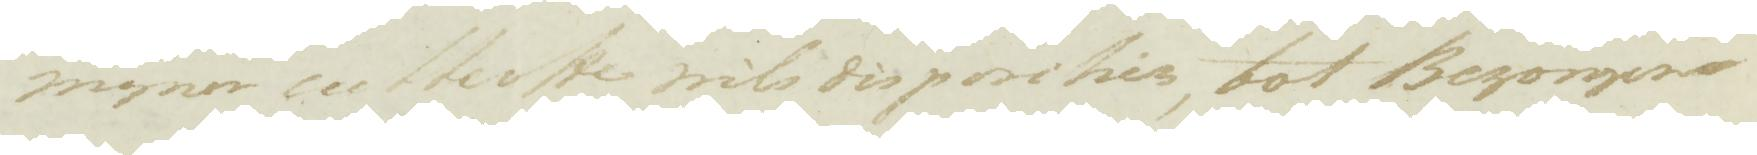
myner uitterste wils dispositien, tot Bezorger
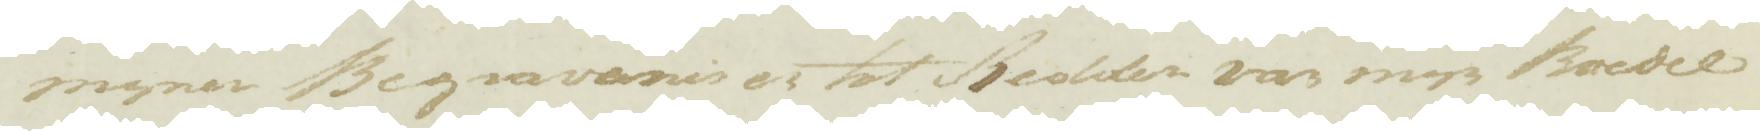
myner Begravanis en tot Redder van myn Boedel
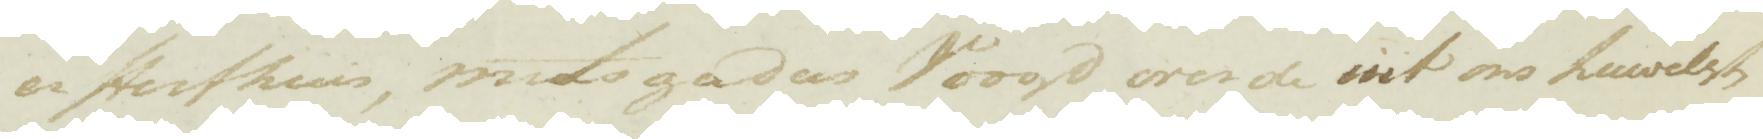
en sterfhuis, mitsgaders Voogd over de uit ons huwelyk
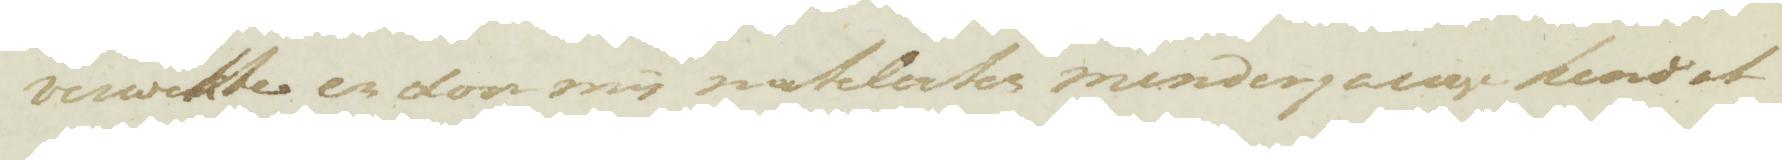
verwekte en door mij natelaeten minderjarige kind of
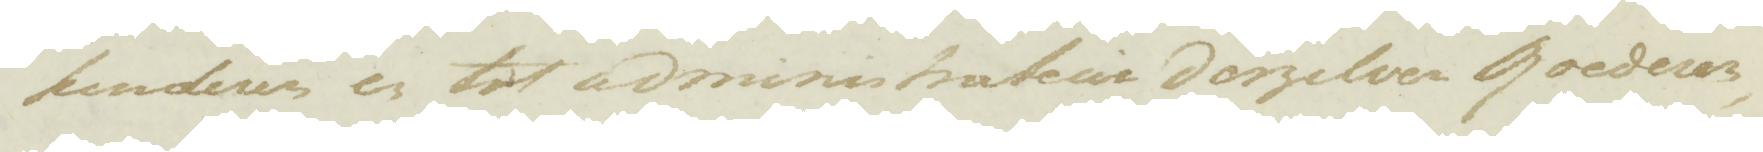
kinderen en tot administrateur derzelven goederen,
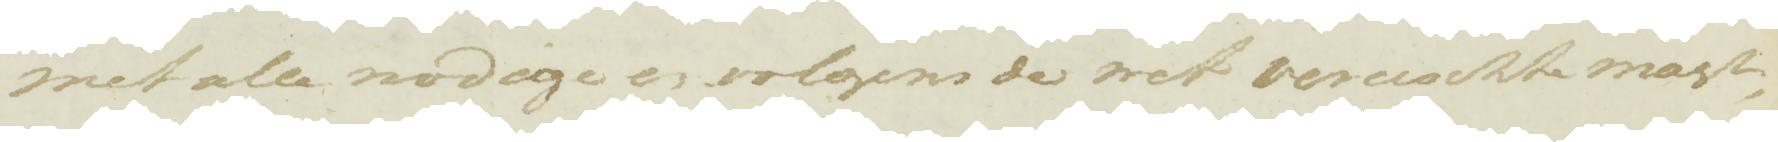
met alle nodige en volgens de wet vereischte magt,
